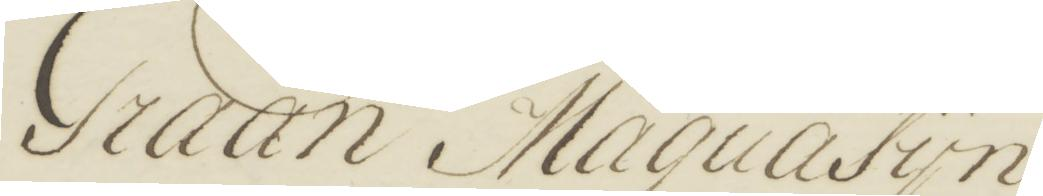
Graan Maguasijn
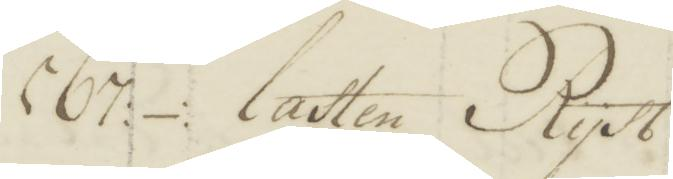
567:—: lasten Rijst
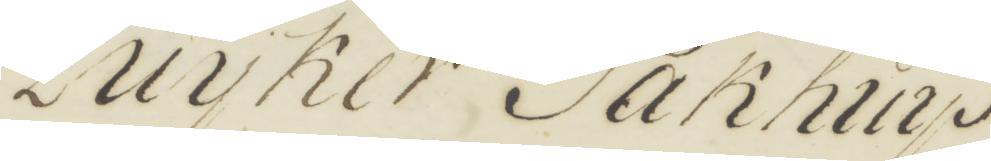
Zuijker Pakhuijs
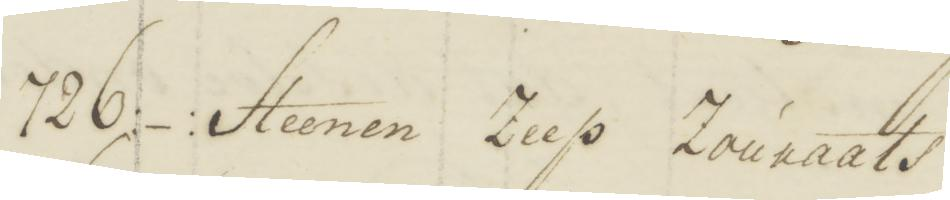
726:—: steenen Zeep Zouraats
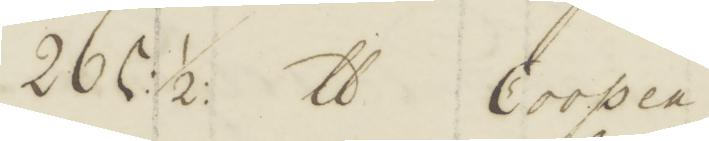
265:½: lb Cooper
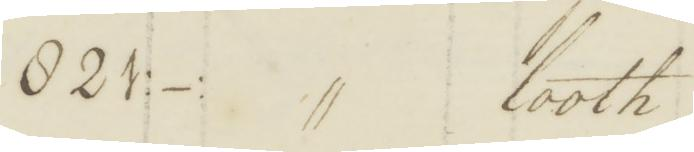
821:—: „ looth
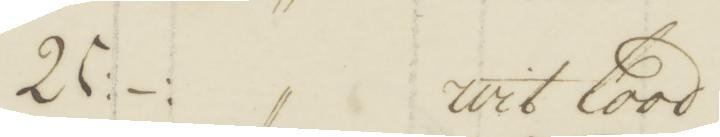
25:—: „ wit lood
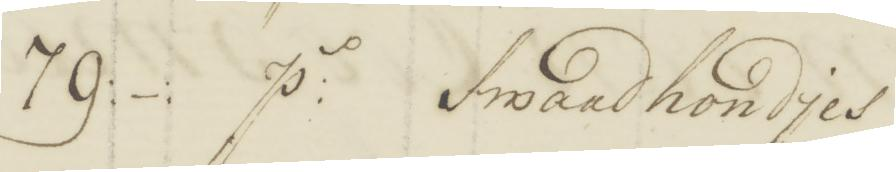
79:—: p:s swardhoudjes
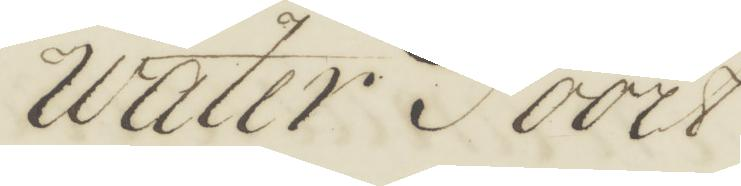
water Poort
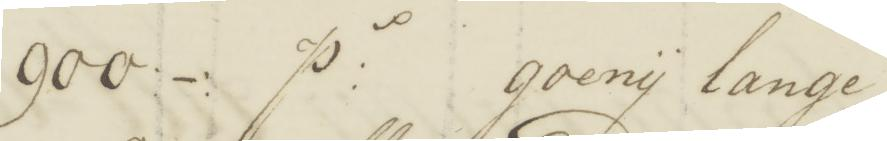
900:—: p:s goenij lange
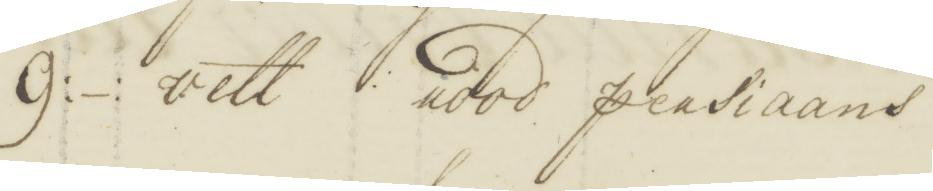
9:—: vell: rood persiaans
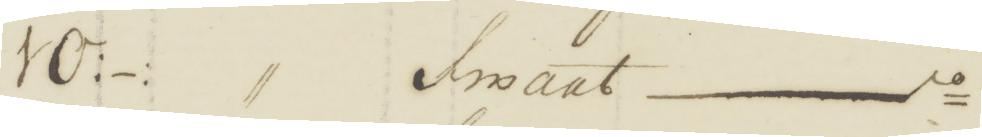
10:—: „ swart _=o
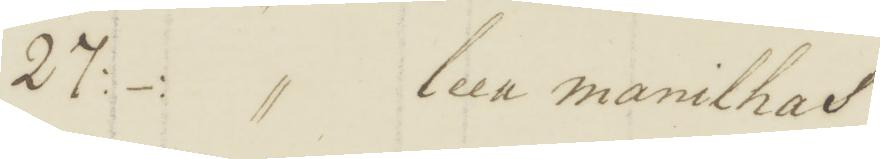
27:—: „ leer manilhas
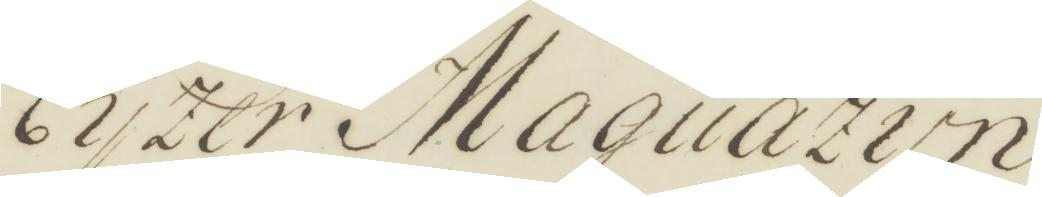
Eijzer Maguazijn
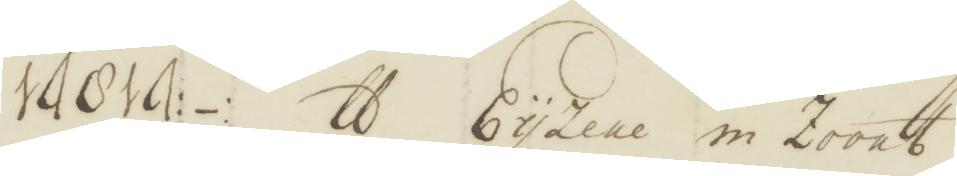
14814:—: lb Eijzere in Zoort
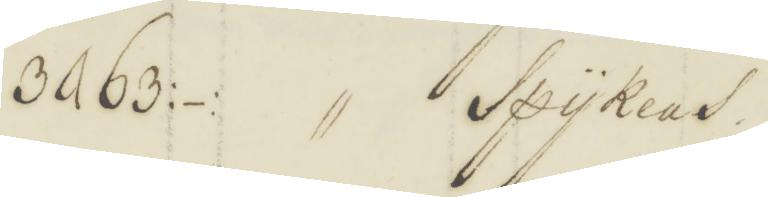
3463:—: spijkers.
